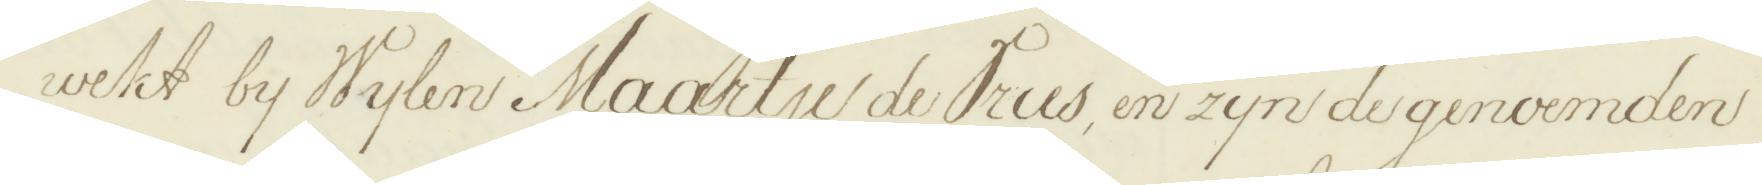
wekt by Wijlen Maartje de Vries, en zyn de genoemden
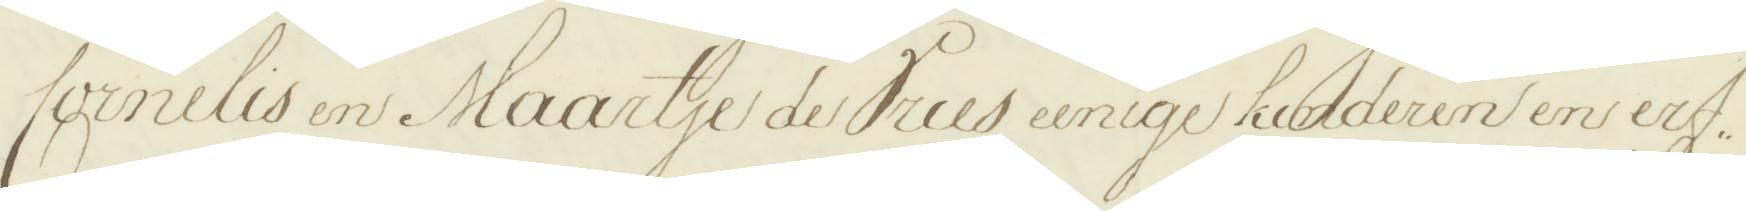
Cornelis en Maartje de Vries eenige kinderen en erf„
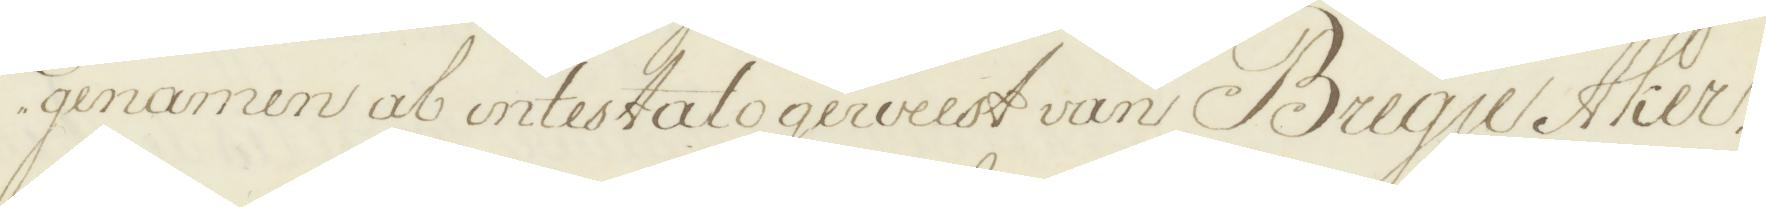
„genamen ab intestato geweest van Bregje Aker„
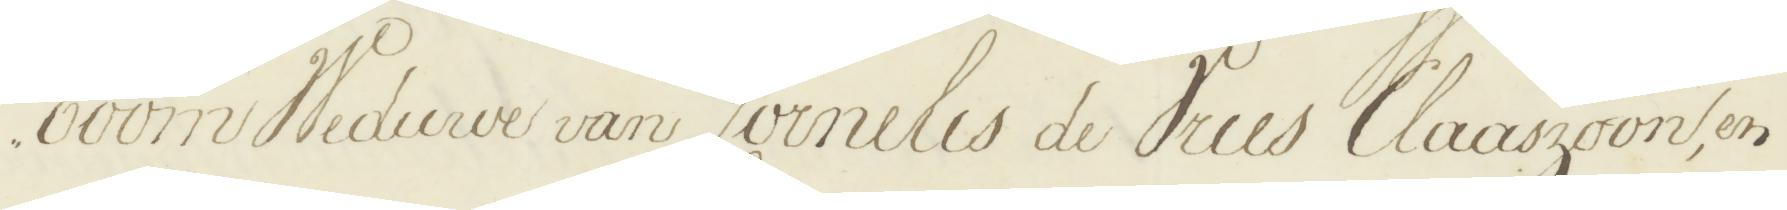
„boom Weduwe van Cornelis de Vries Claaszoon, en
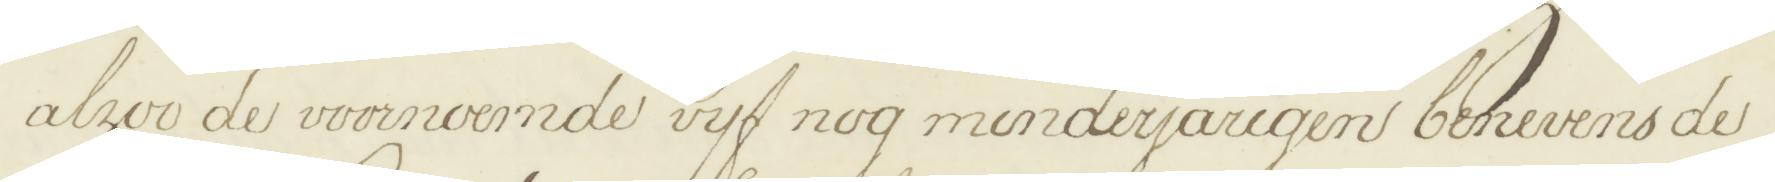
alzoo de voornoemde vyf nog minderjarigen benevens de
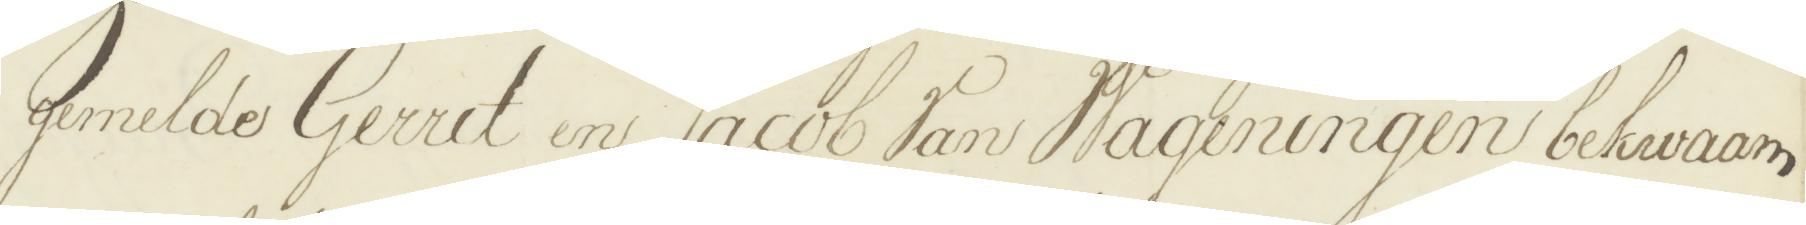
gemelde Gerrit en Jacbb Van Wageningen bekwaam
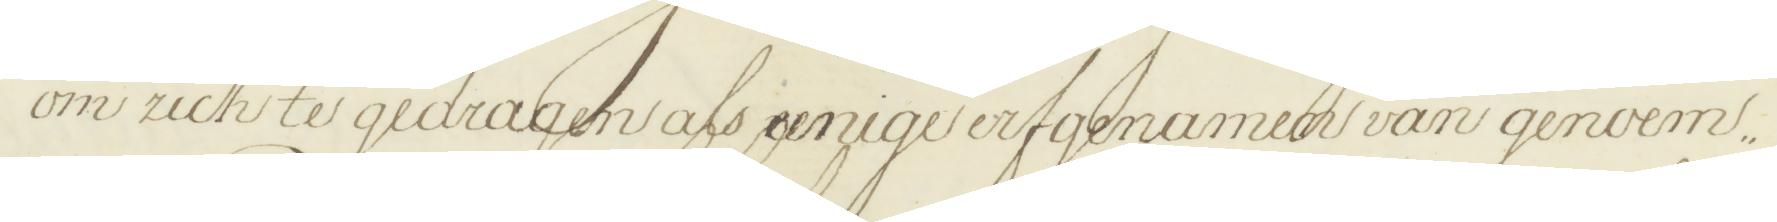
om zich te gedragen als eenige erfgenamen van genoem„
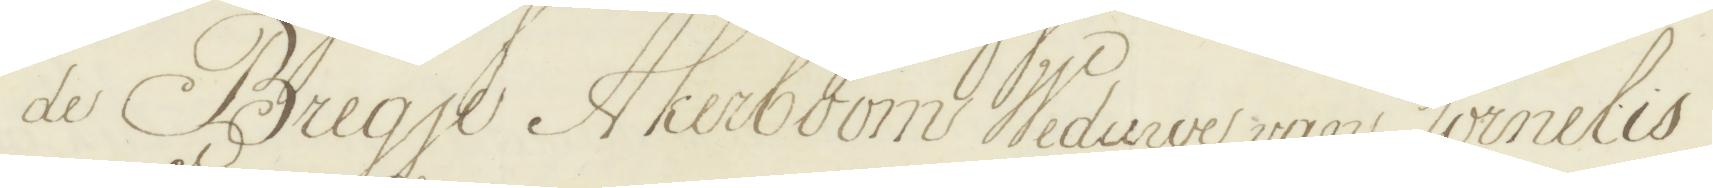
de Bregje Akerboom Weduwe van Cornelis
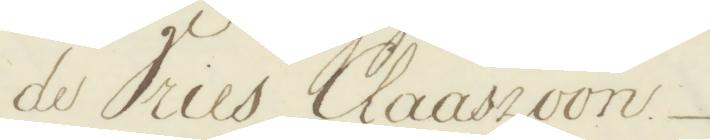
de Vries Claaszoon.
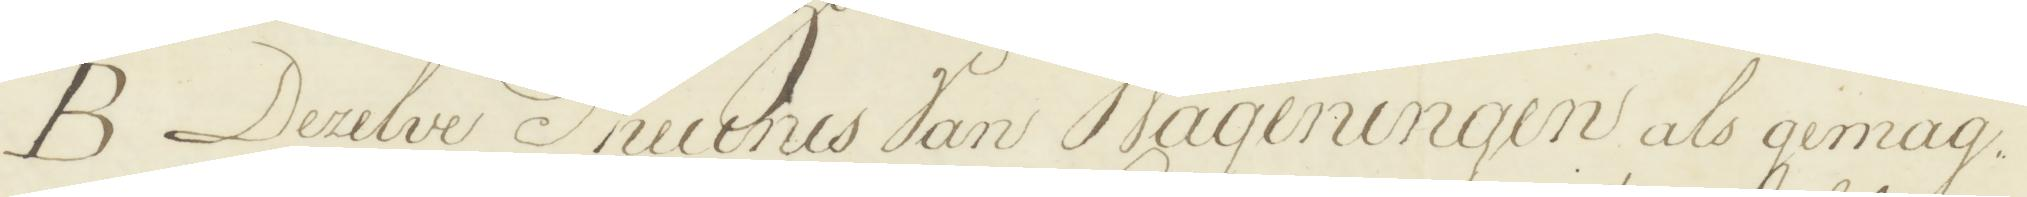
B Dezelve Theunis Van Wageningen, als gemag„
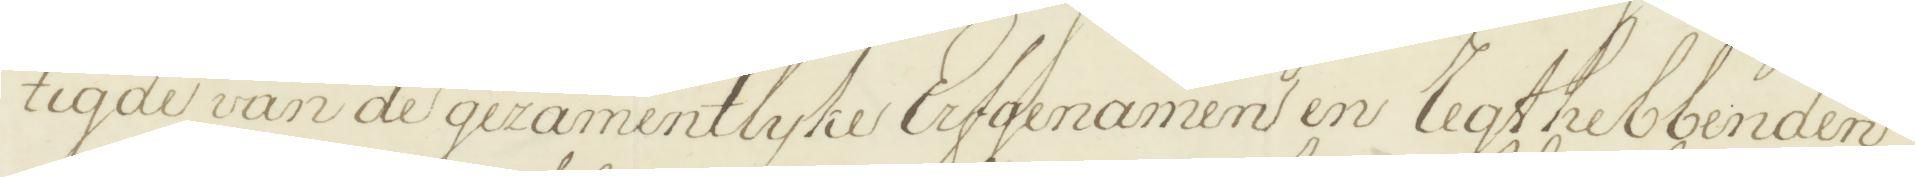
tigde van de gezamentlyke Erfgenamen en regthebbenden
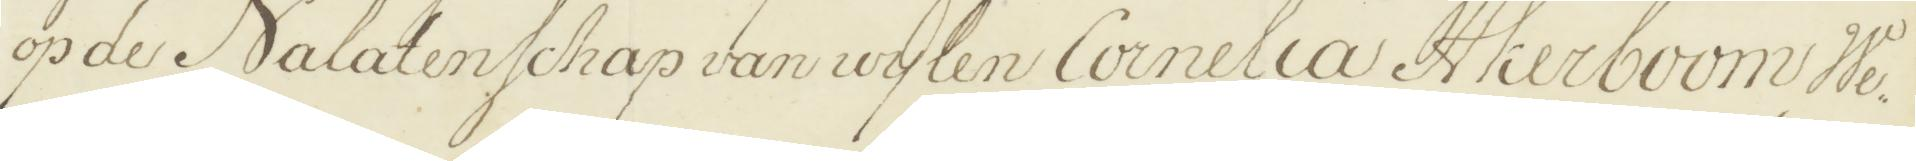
op de Nalatenschap van wylen Cornelia Akerboom We„
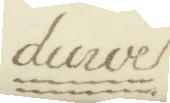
duwe
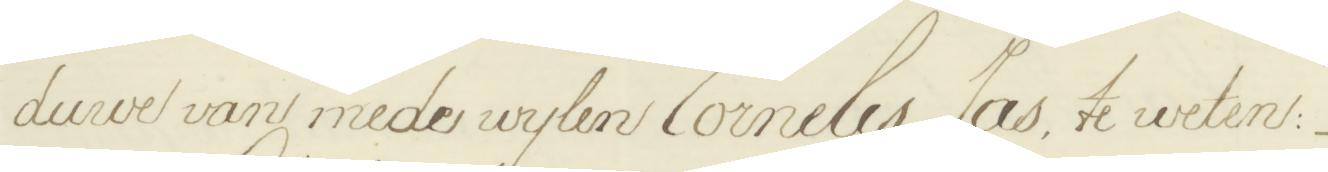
duwe van mede wylen Cornelis Jas, te weten:
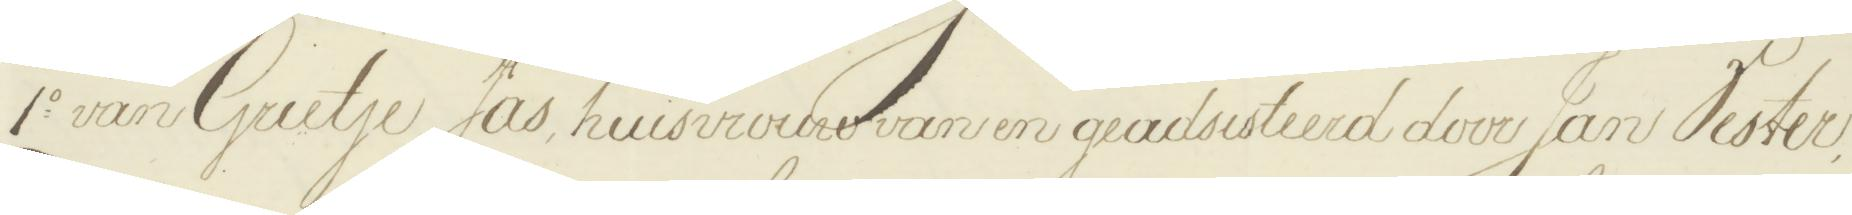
1:o van Grietje Jas, huisvrouw van en geadsisteerd door Jan Vester,
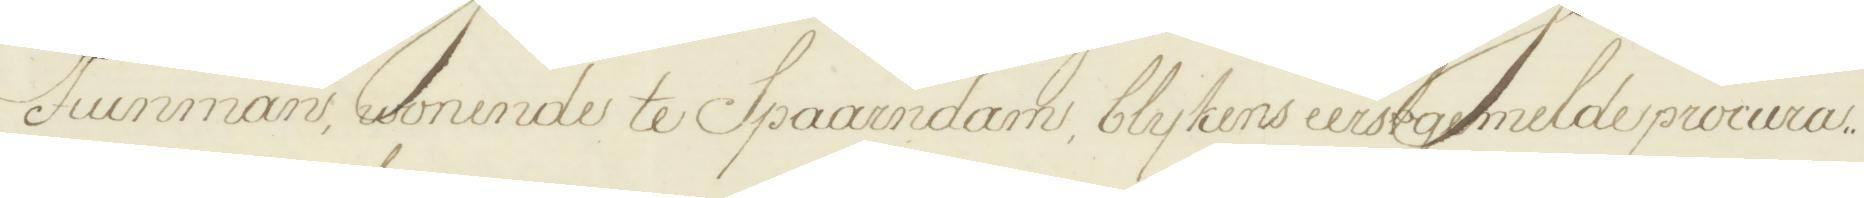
Tuinman, wonende te Spaarndam, blykens eerst gemelde procura„
